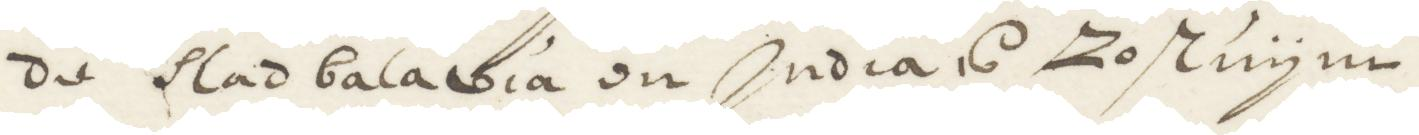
de stad batavia en India is zo ruijm
